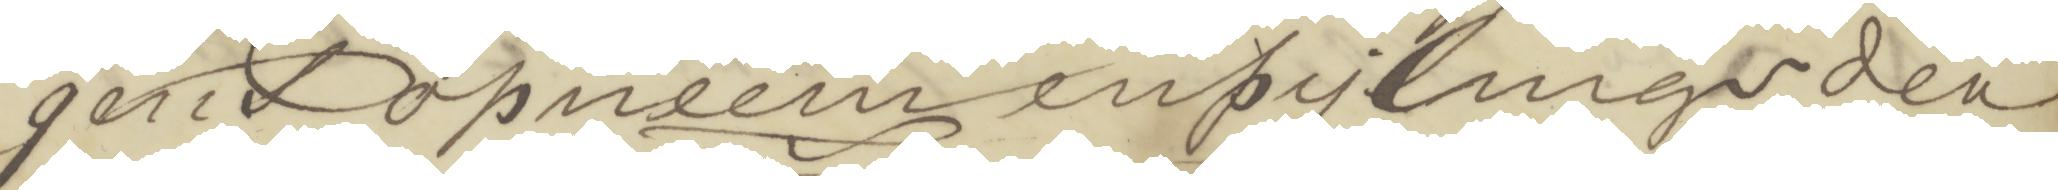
gens opneem en pijlinge der
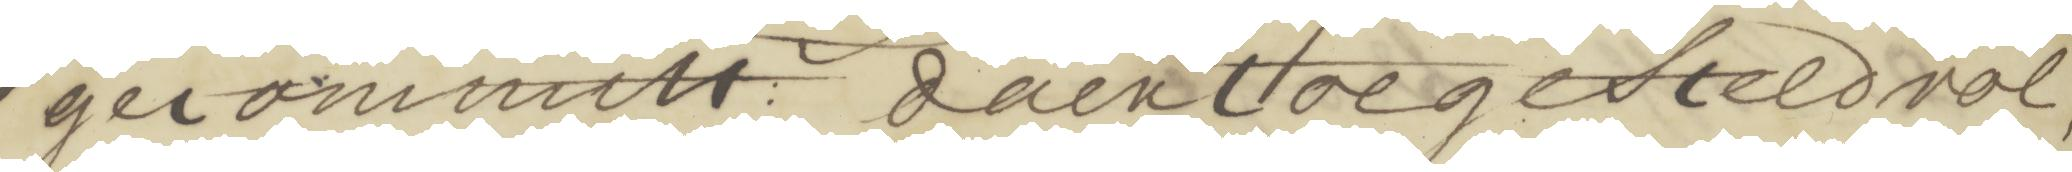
gecommitt: daer toe gesteld vol
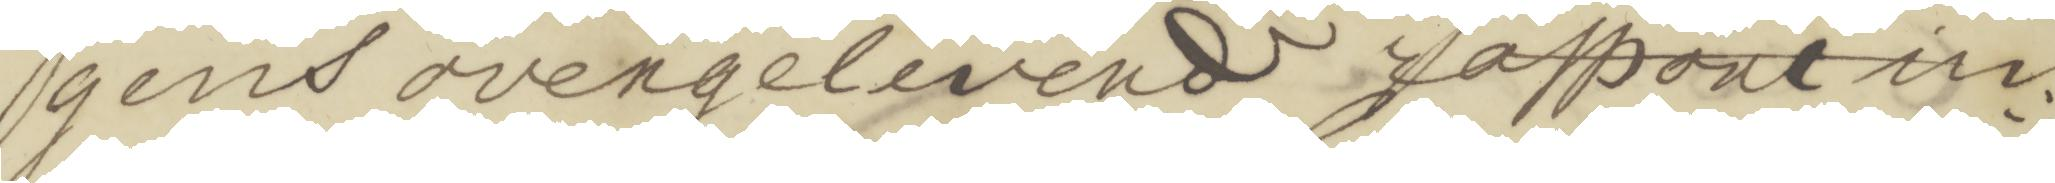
gens overgeleverde rapport in
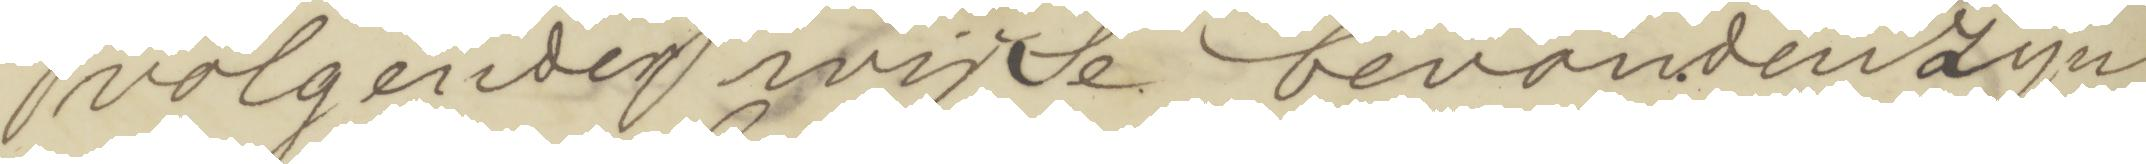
volgender wijse bevonden zijn
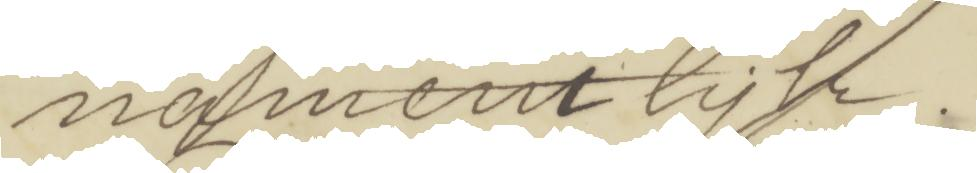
namentlijk.
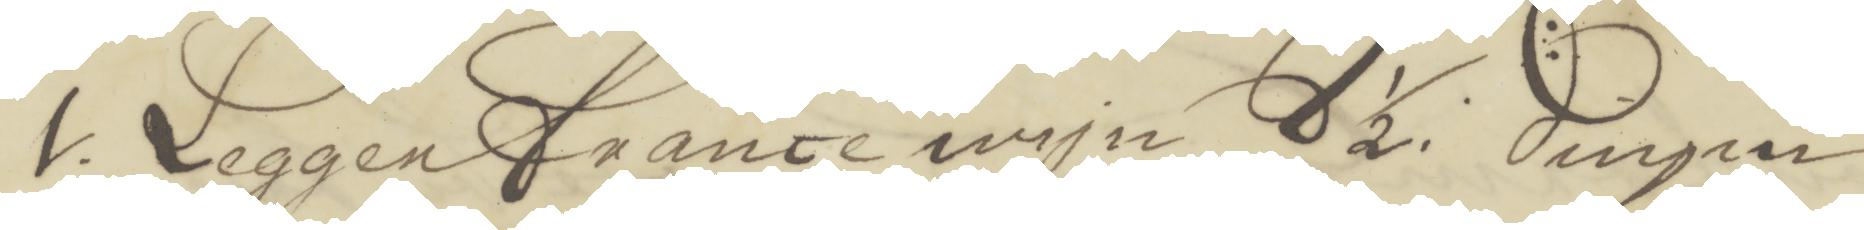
1. Legger France wijn 8½: duym
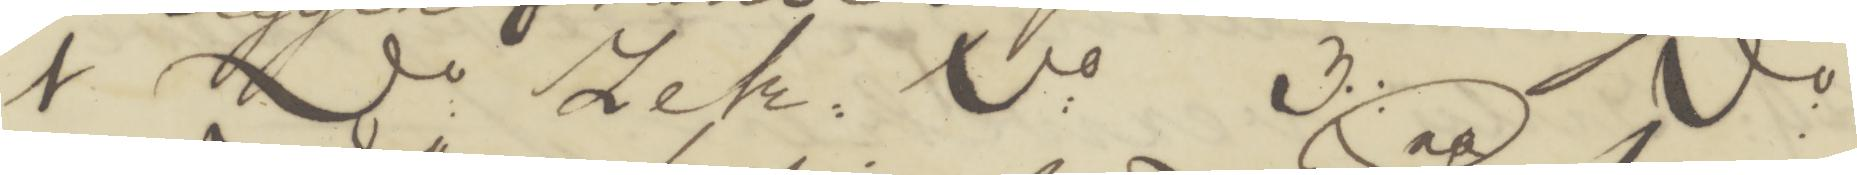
1 D:o Zek: D:o 3.: D:o
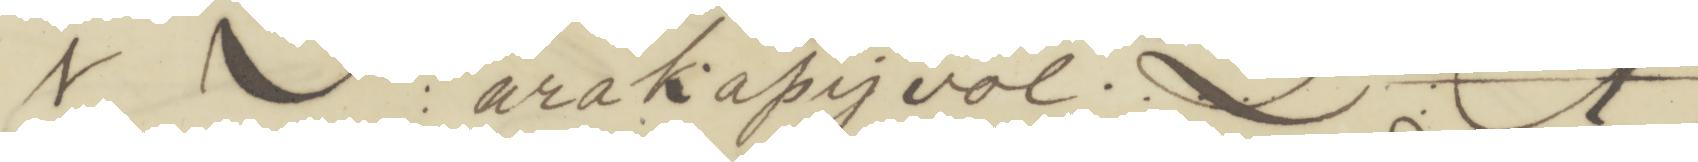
1 D:o arakapij vol - - - L:aa A.
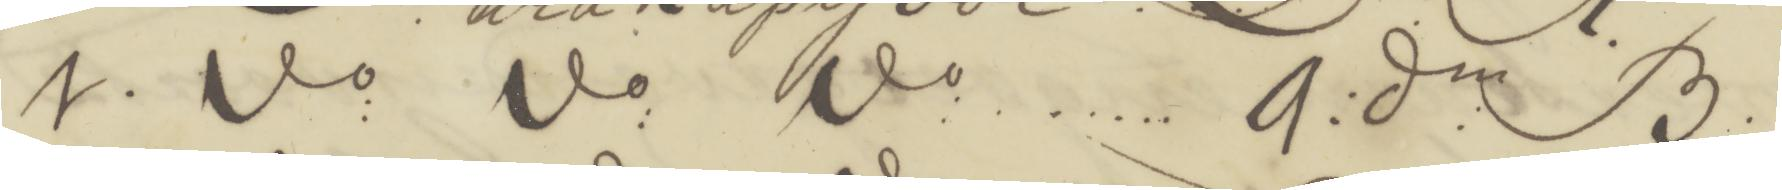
1. D:o D:o D:o - - - - - - 4: d:m B
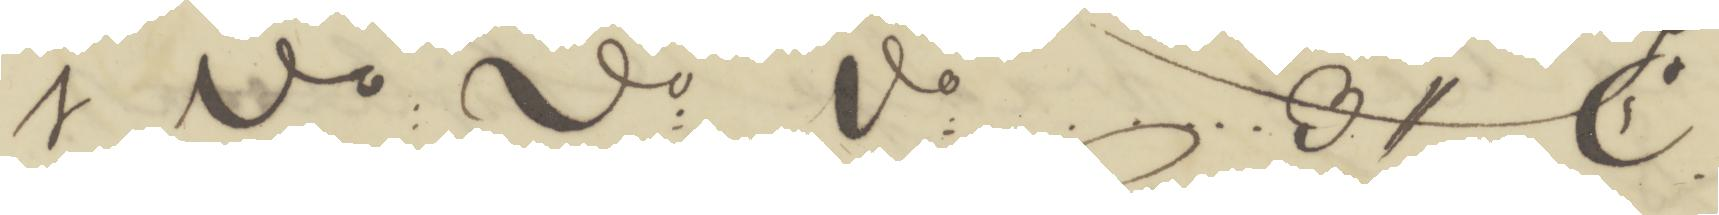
1 D:o: D:o D:o - - - - - 3 „ C.
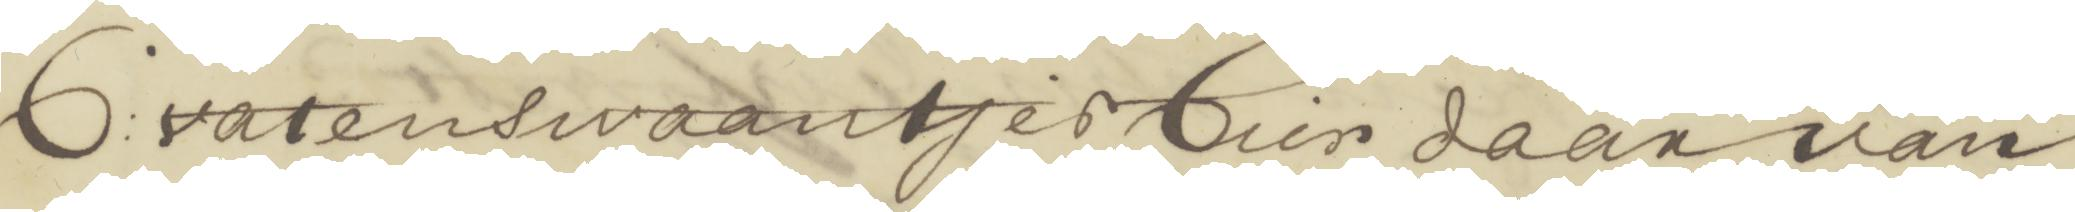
6: vatenswaantjes bier daar van
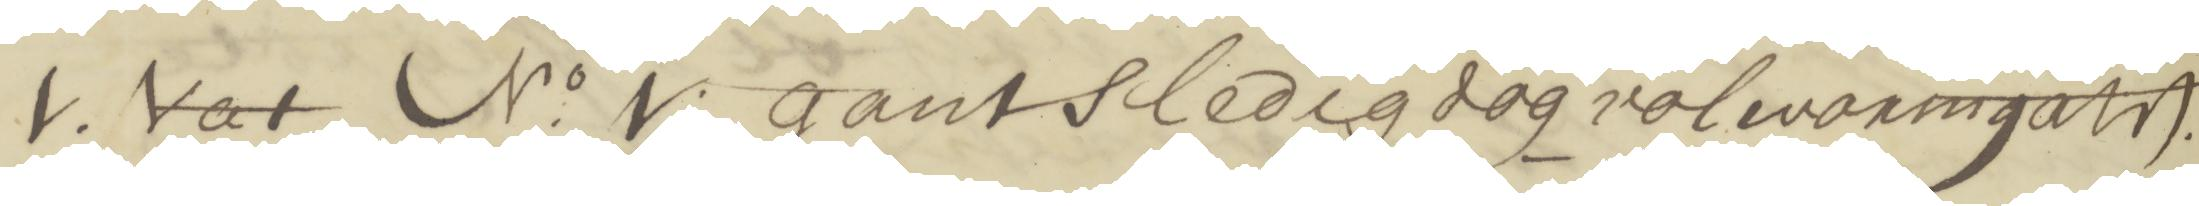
1. Vat N:o 1: gants ledig dog vol wormgaten
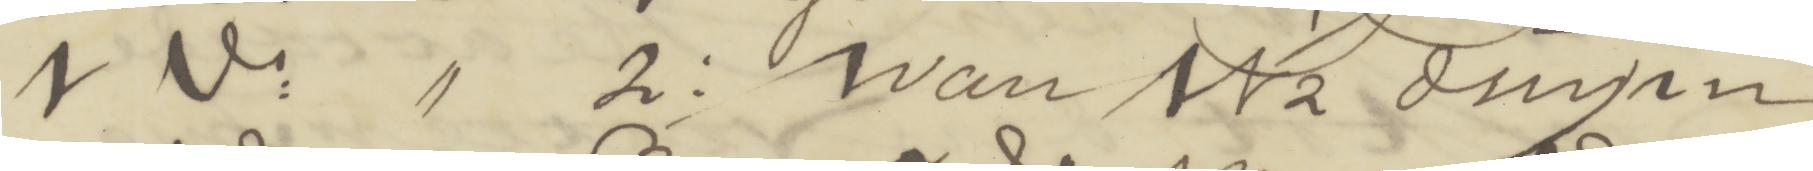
1 D:o „ 2: 1 van 11½ duym
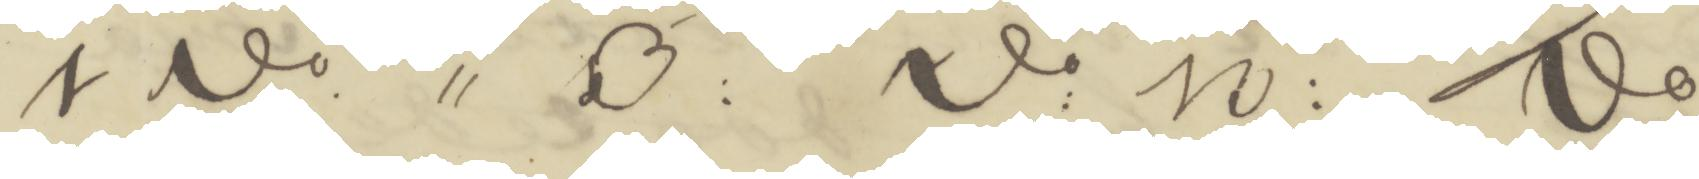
1 D:o „ 3: D:o 10: Do
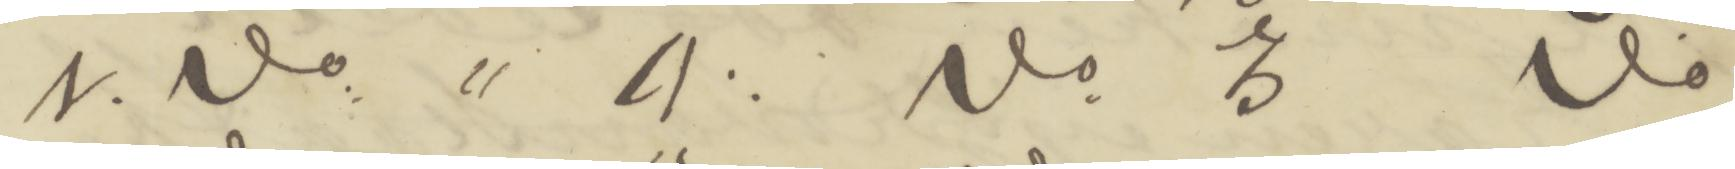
1. D:o „ 4: D„o 3 D.o
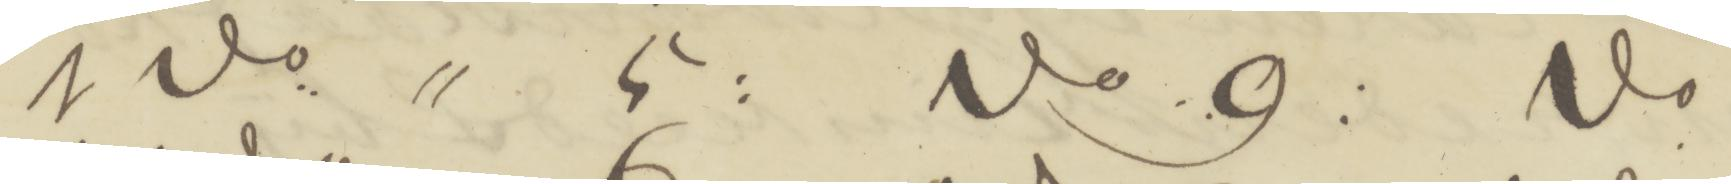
1 D:o „ 5: D:o 9: D.o
